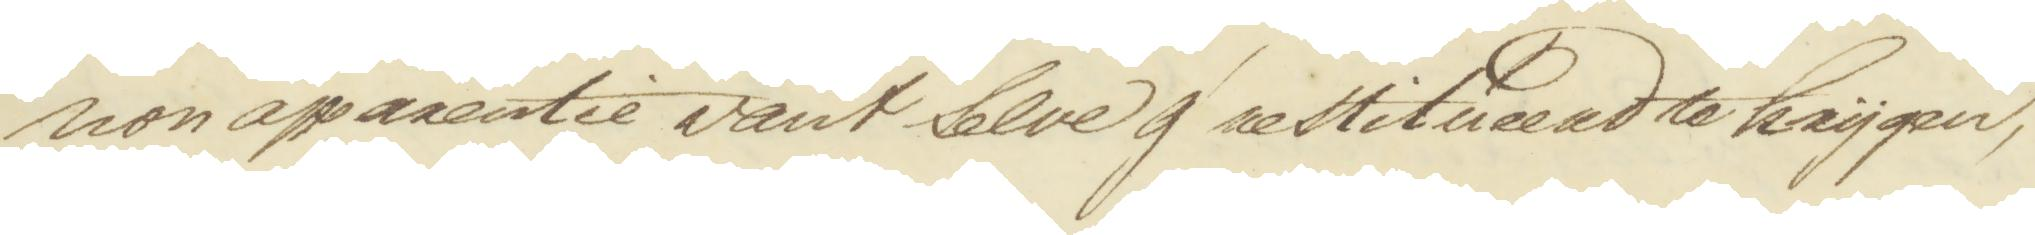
non apparentie van't selve g'restitueerd te krijgen,
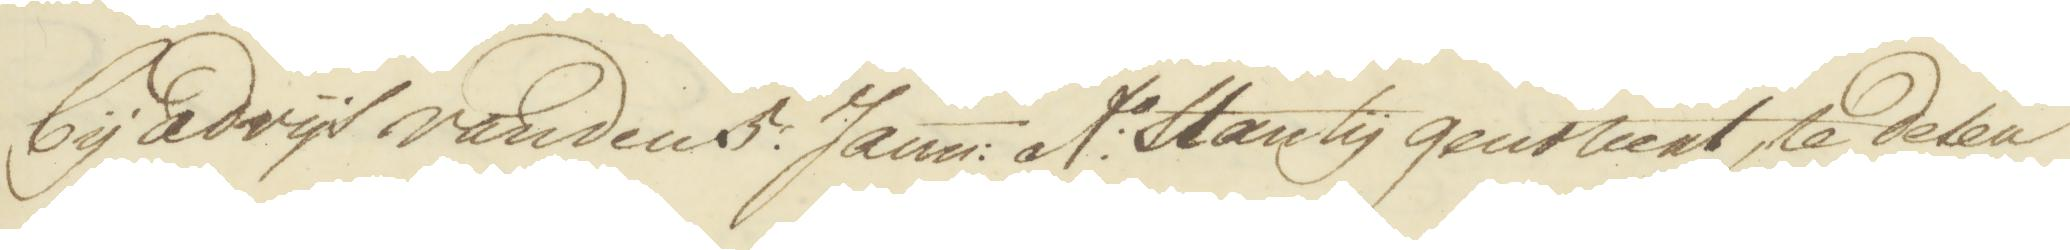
bij advijs van den 5:' Jann: A:o stantij gensteert, te deser
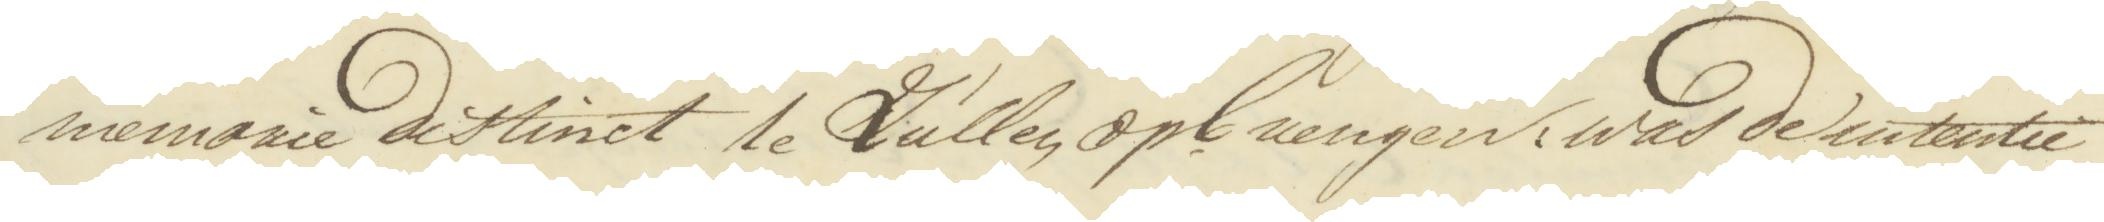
memorie distinct te zullen opbrengen, was de intentie
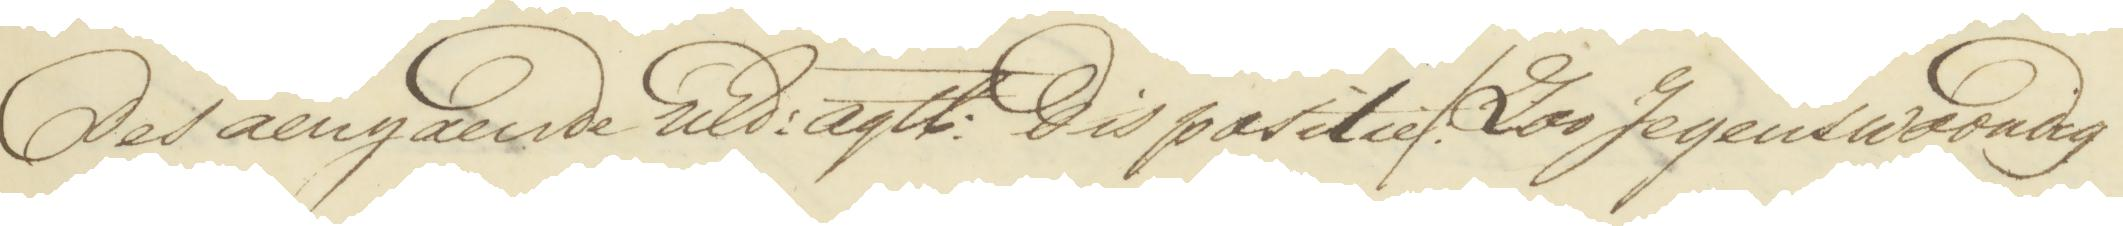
des aengaende uEd: agtb: dispositie /:zoo Jegenswoordig
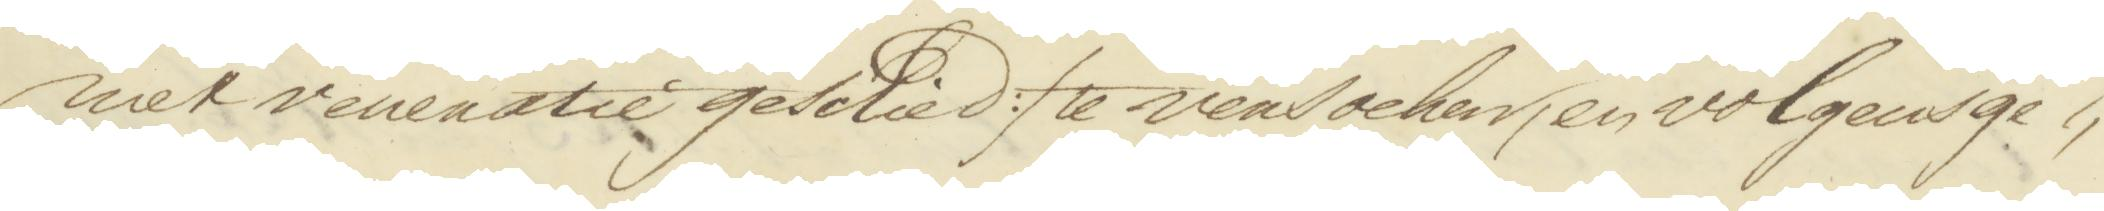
met veneratie geschied:/ te versoeken, en volgens ge„
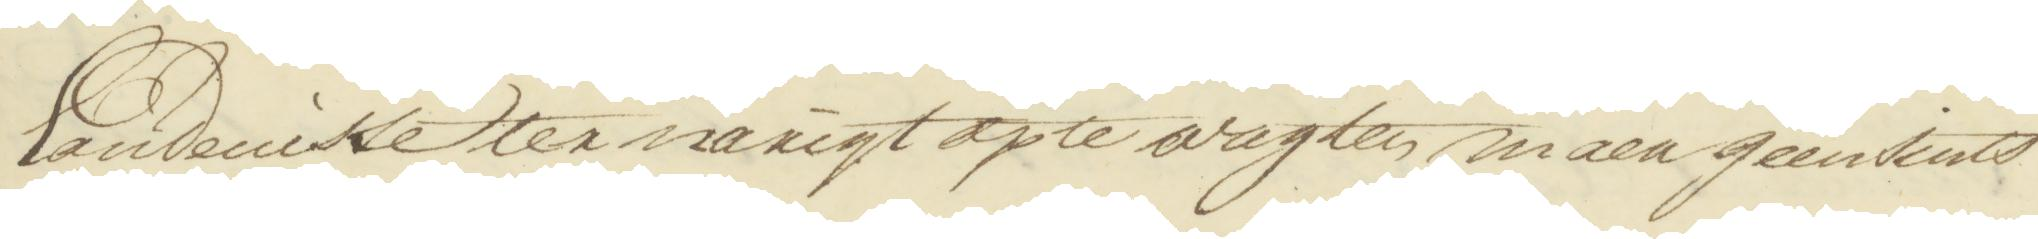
houdenisse ter narigt op te wagten, maer geensints
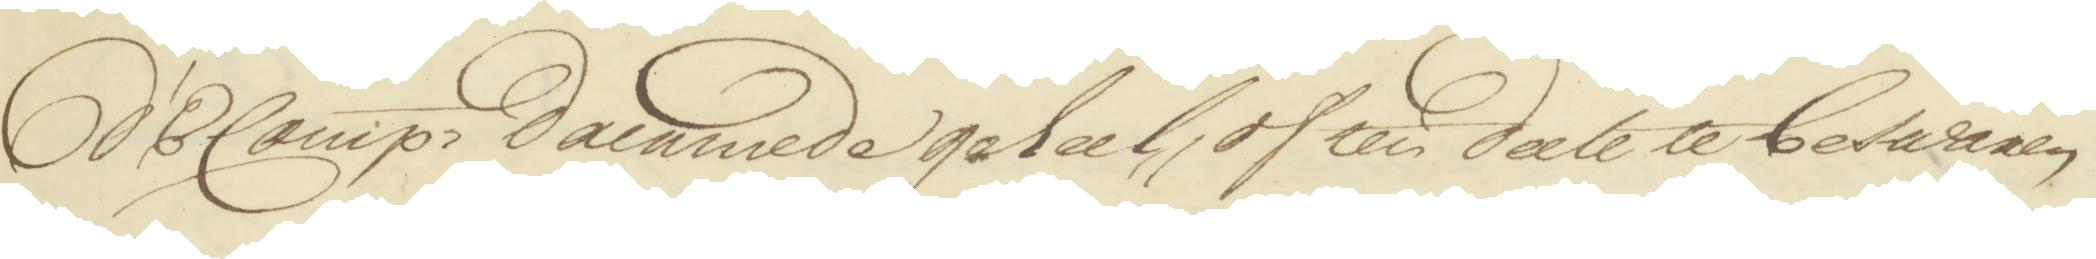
d'E Comp: daermede geheel, of ten deele te beswaren
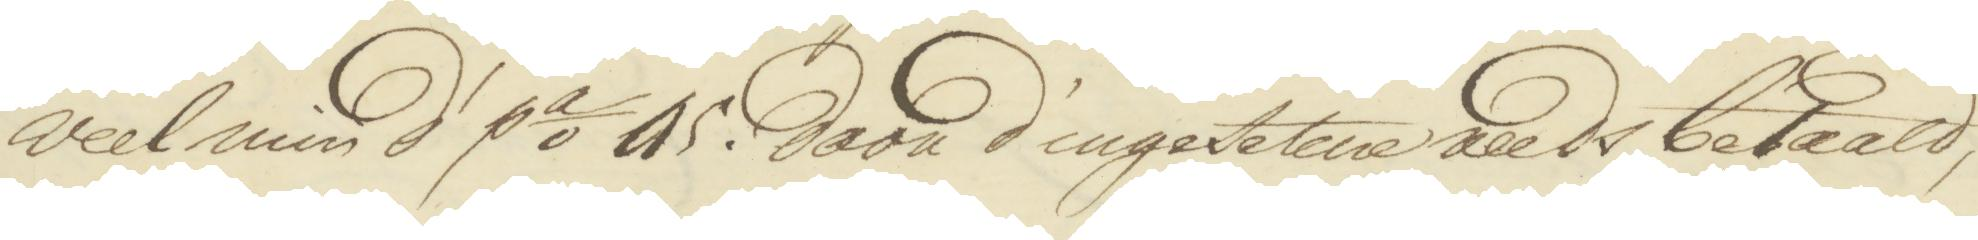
veel min d' pa/o 45. door d'ingesetene reeds betaald,
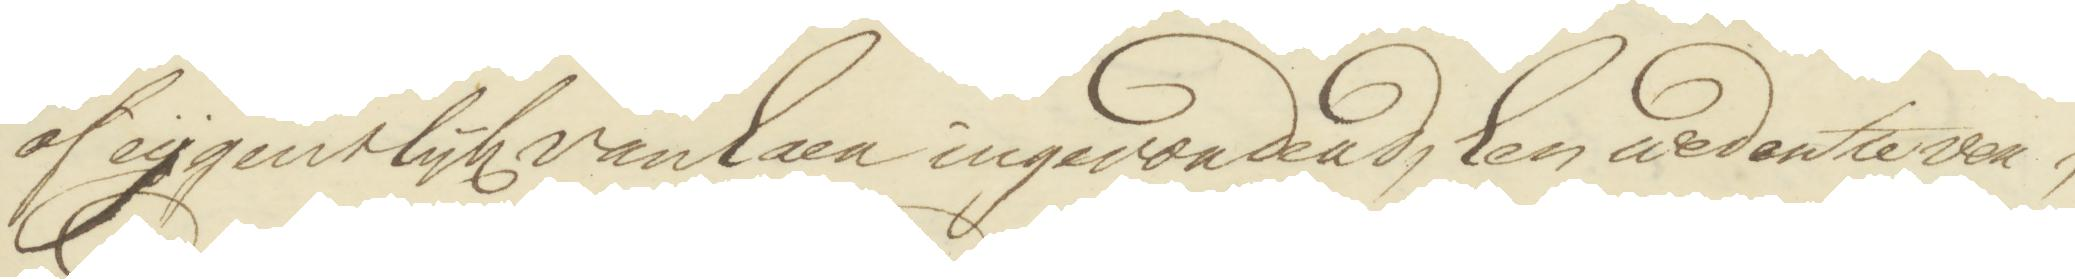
of eijgentlijk van haer ingevorderd, hen weder te ver
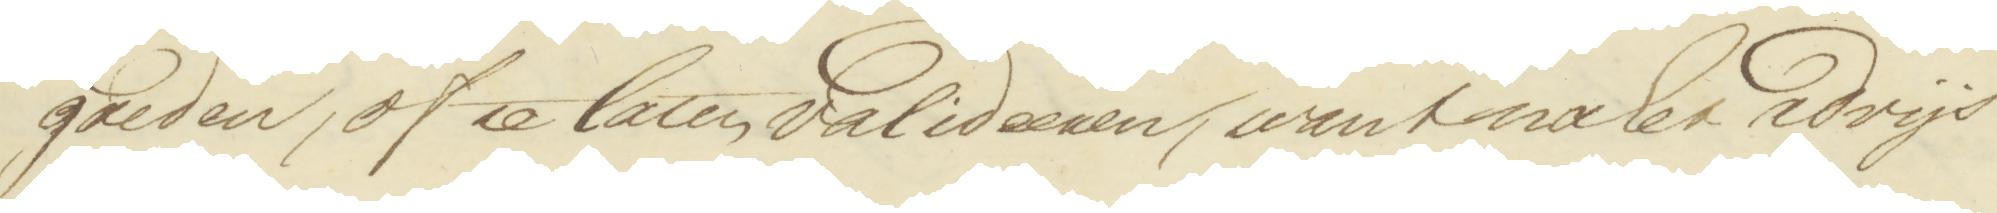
goeden, of te laten valideeren, want na het advijs
